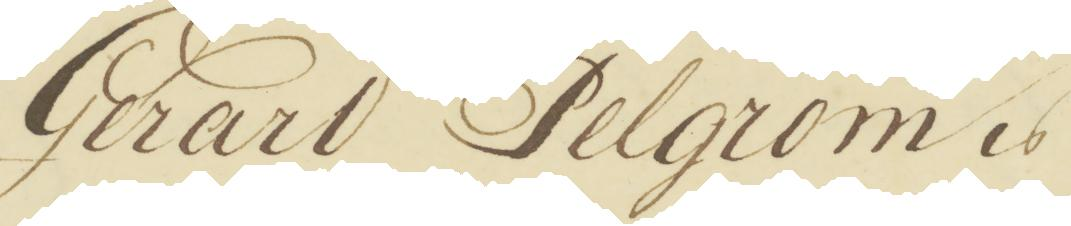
Gerard Pelgrom is
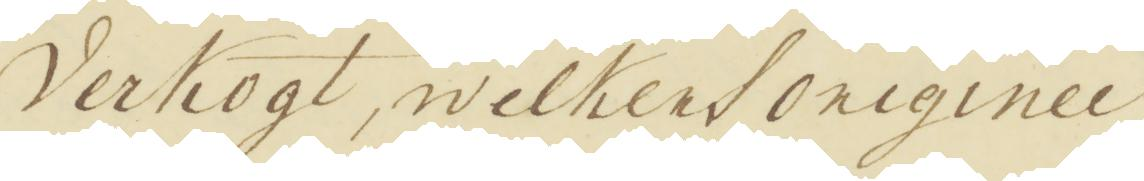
Verkogt, welkers originee
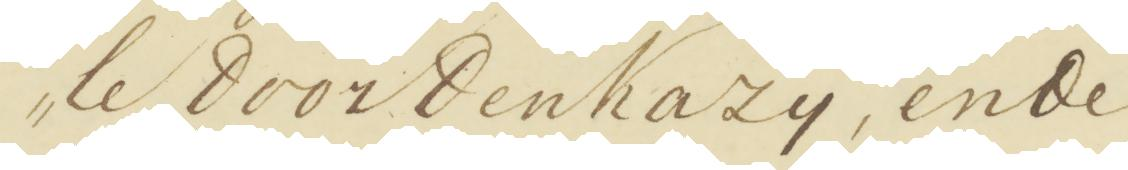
„le door den Kazij, ende
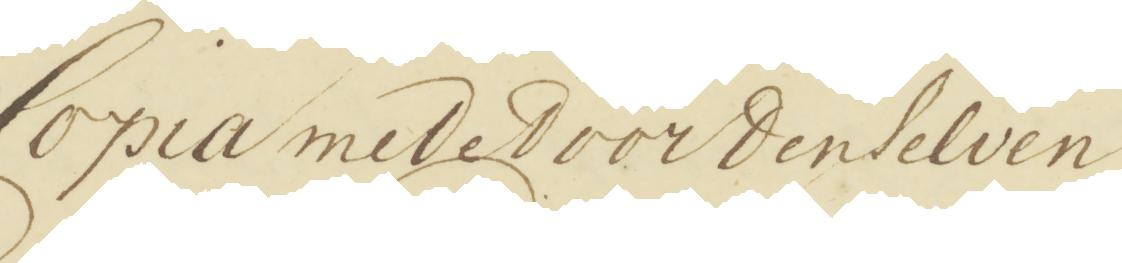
Copia mede door den selven
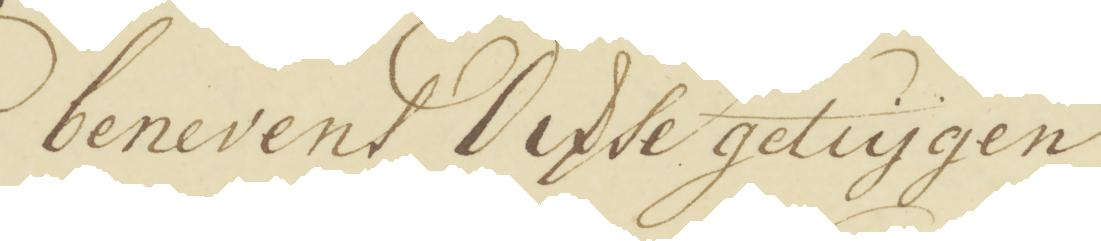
benevens diverse getujgen
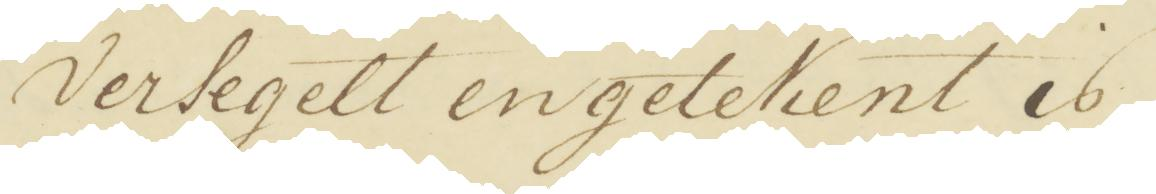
versegelt en getekent is
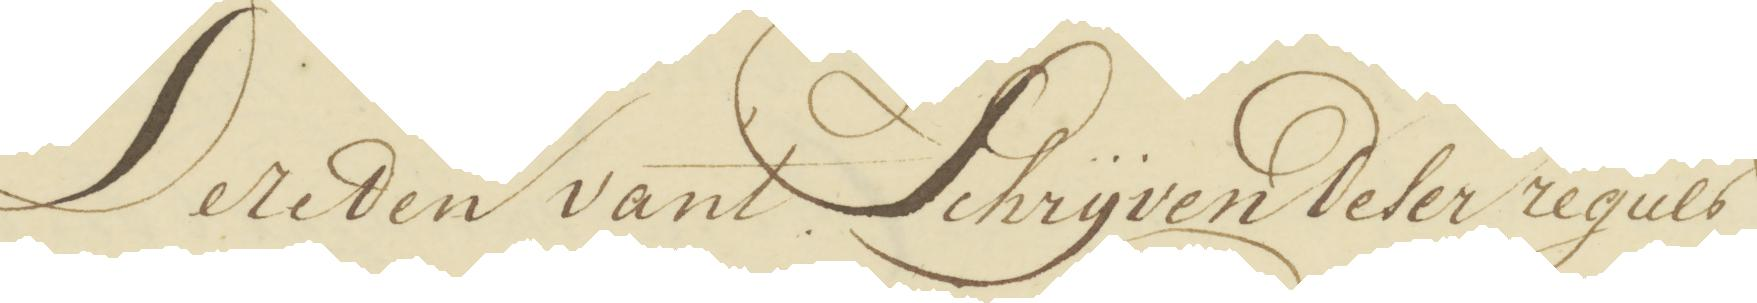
De reden van't Schrijven deser reguls
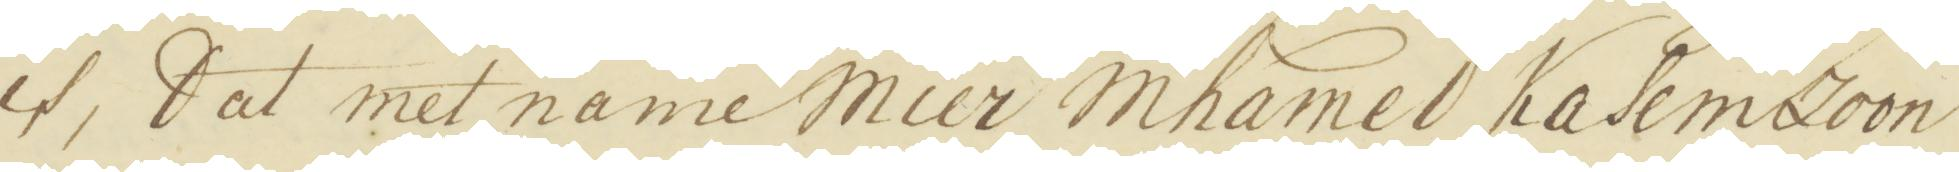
is, dat met name mier mhamed Kasem Zoon
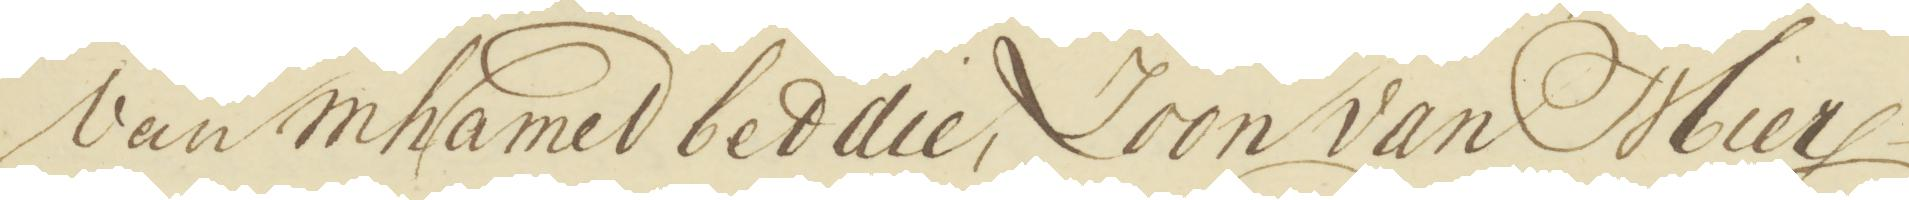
van mhamed beddie, Zoon van Mier
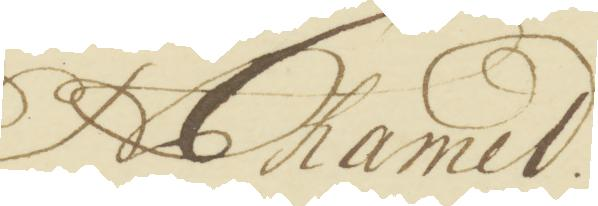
Mhamed
